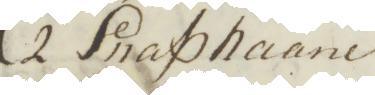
2 Snaphaane
